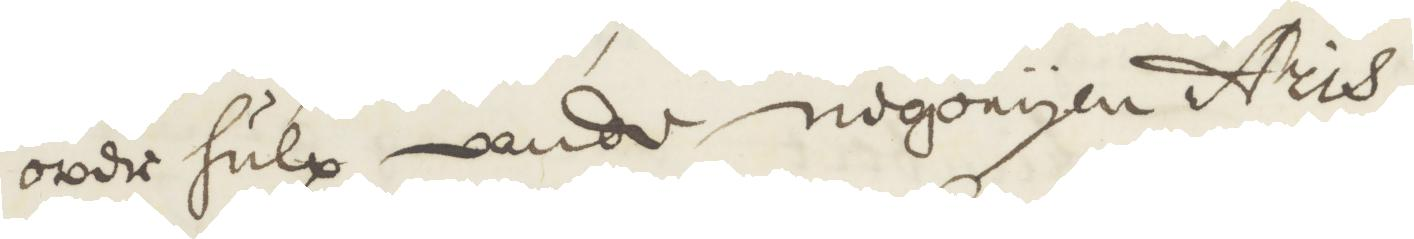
over sulx vande negorijen Aris,
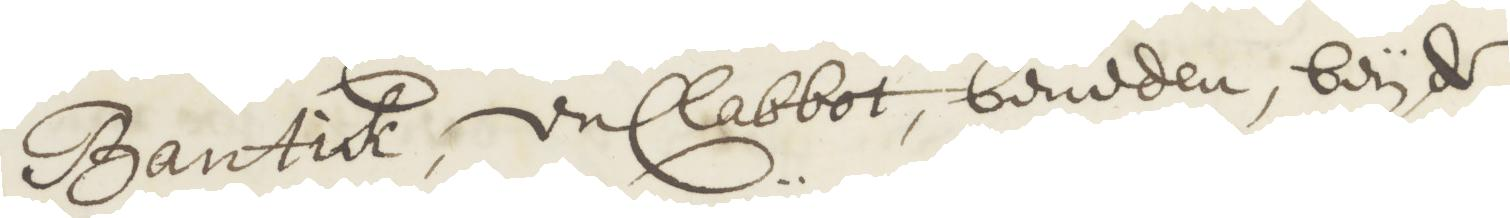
Bantik, en Clabbot, beneden, beijde
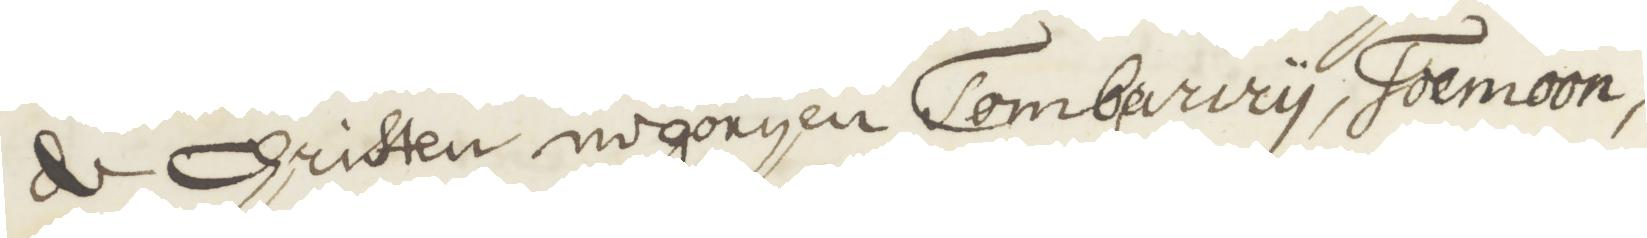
de Christen negorijen Tombaririj, Toemoon,
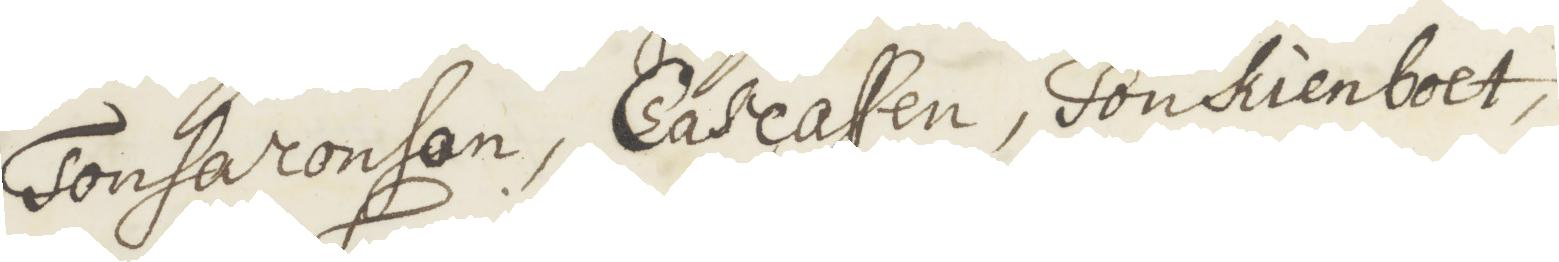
Tonsaronsan, Cascassen, Tonkienboet,
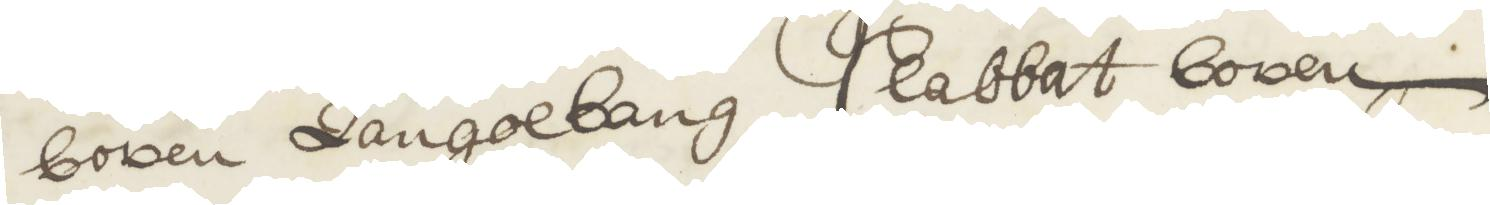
boven Langoebang, Clabbat boven
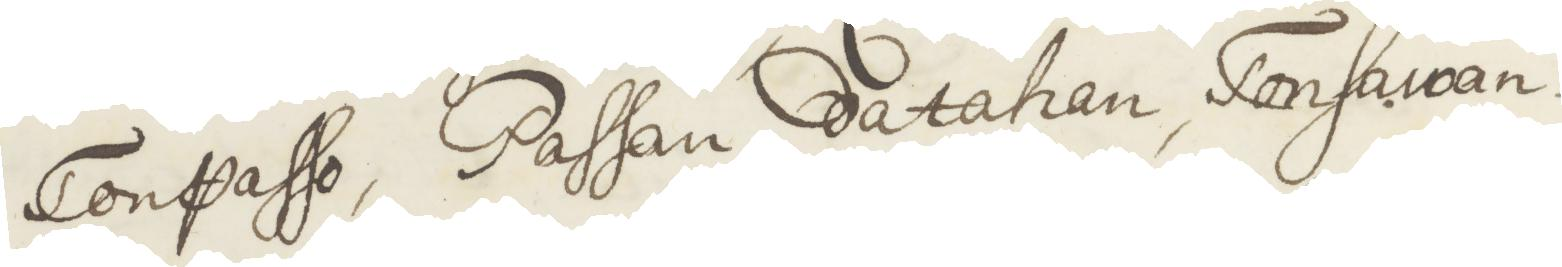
Tonpasso, Passan, datahan, Tonsawan
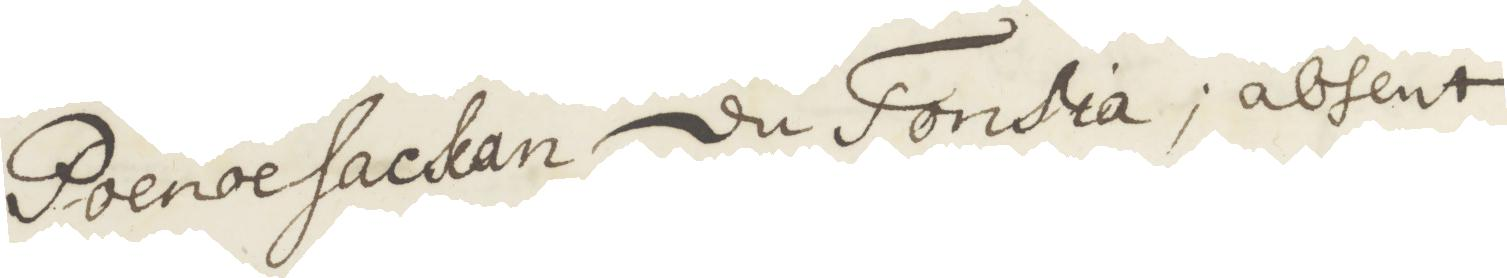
Poenoesackan, en Tonsia; absent
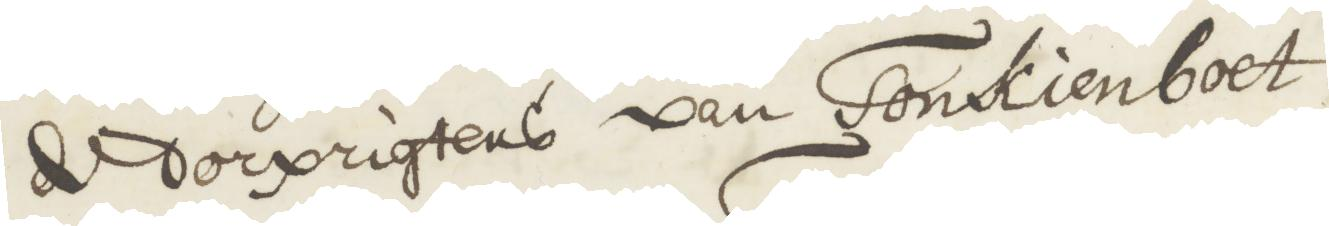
de dorprigters van Tonkienboet
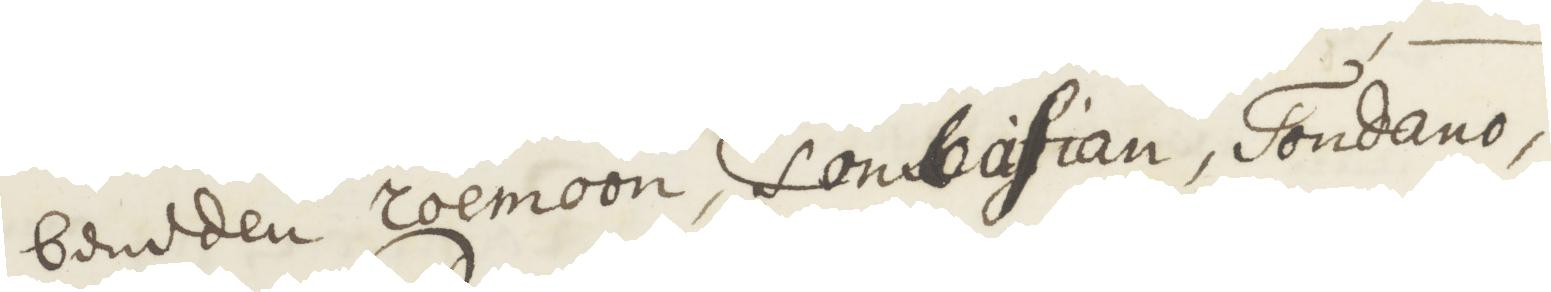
beneden roemoon, Tonbasian, Tondano„
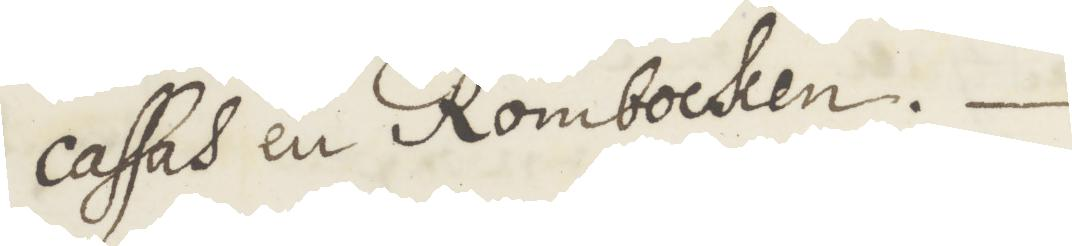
cassas en Romboeken. —
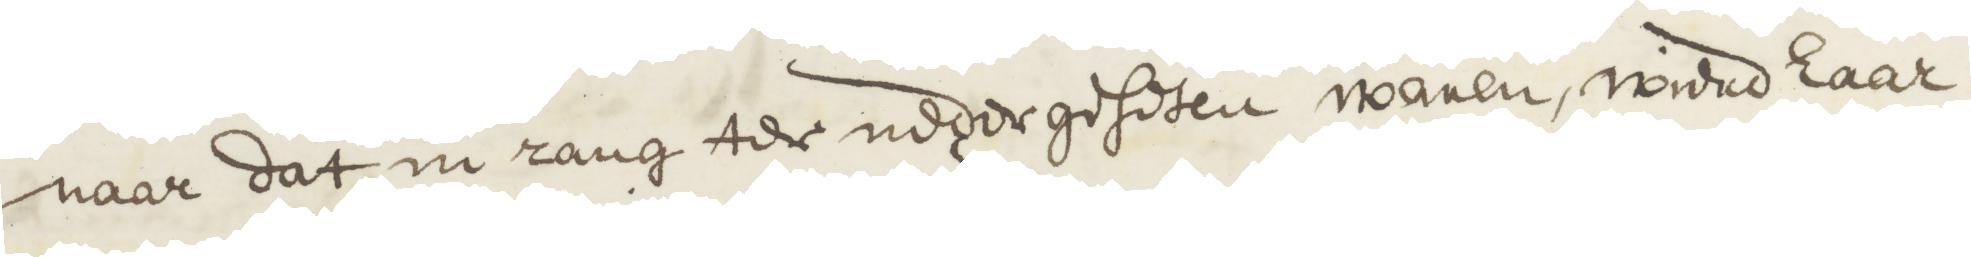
naar dat in rang ter neder geseten waren, wierd haar
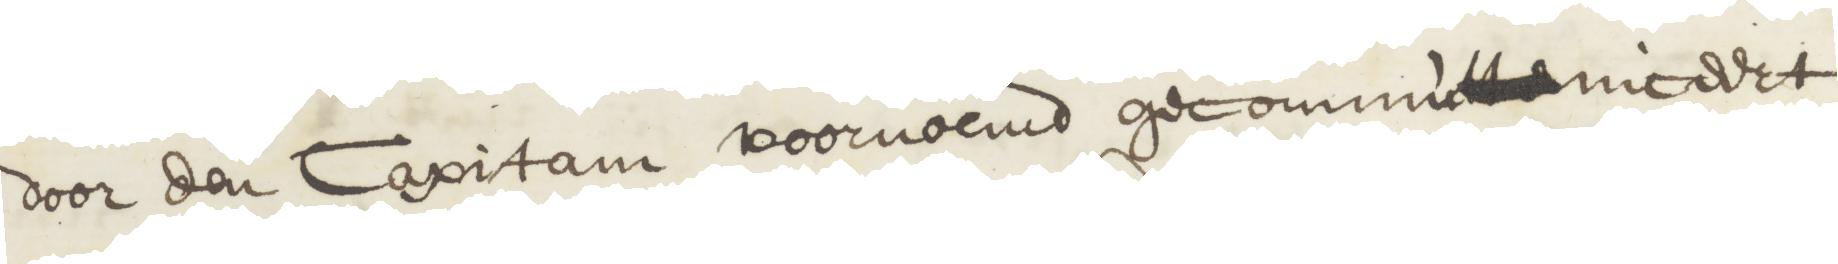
door den Capitain voornoemd gecommutteniceert
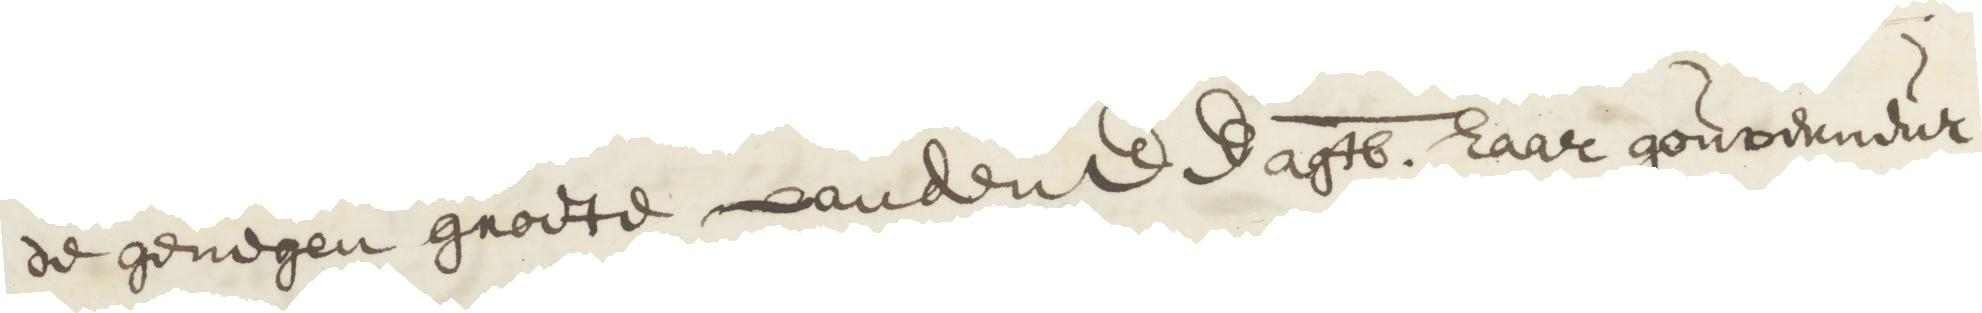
de genegen groete van den E E agtb. haar gouverneur,
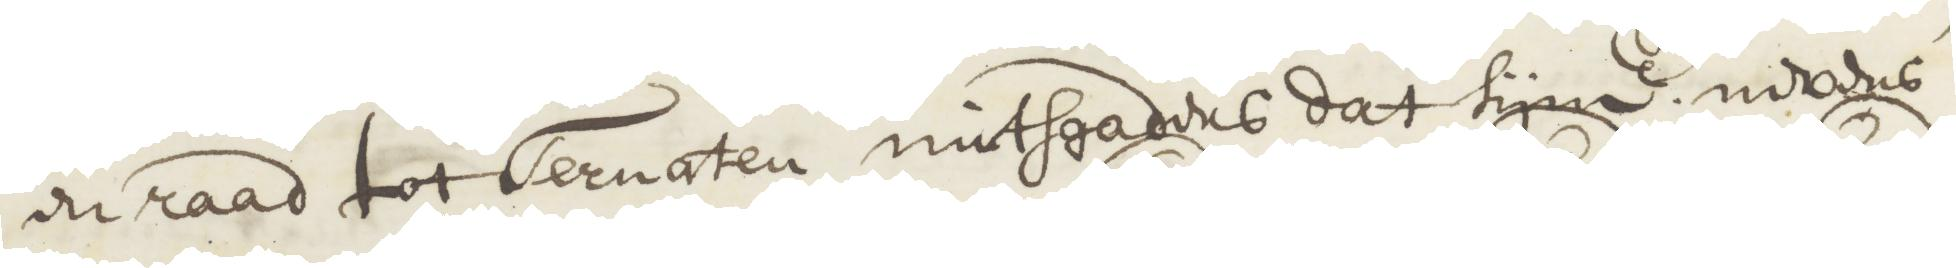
en raad tot Ternaten mitsgaders dat sijn E: nevens
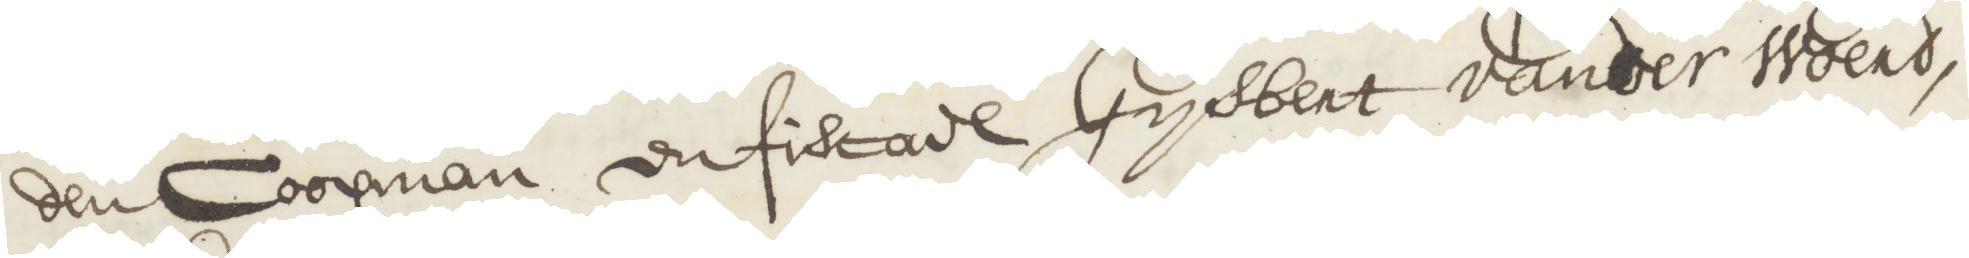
den Coopman en fiscael Gijsbert vander Woerd,
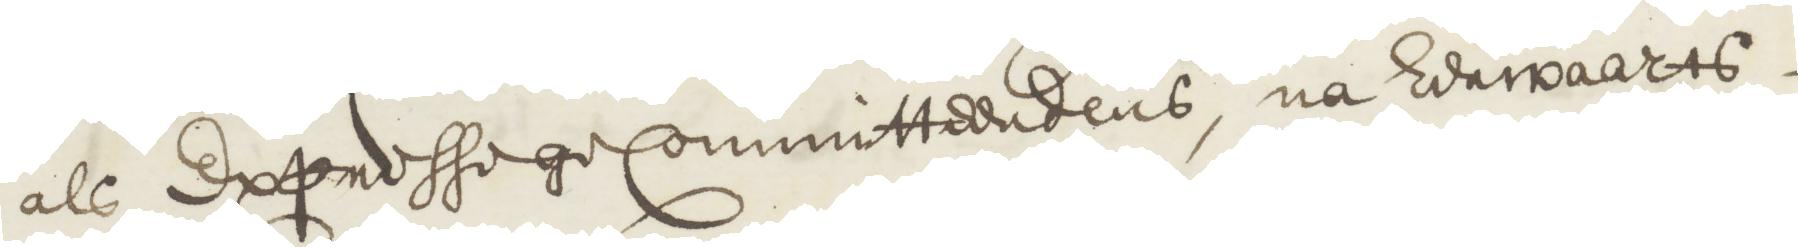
als Expresse gecommitteerdens, na herwaarts
